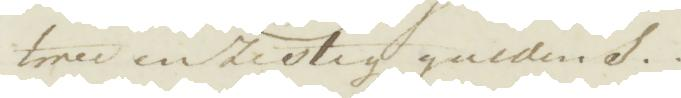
twee en zestig guldens.
